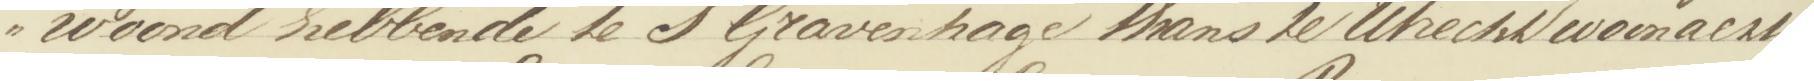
„woond hebbende te S´Gravenhage thans te Utrecht woonachtig
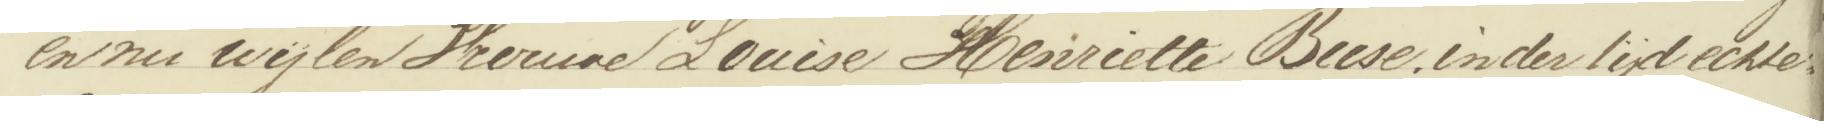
en nu wijlen Vrouwe Louise Henriette Buse, in der tijd echte„
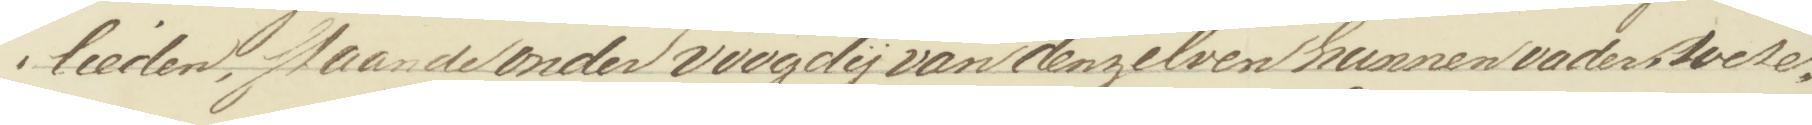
„lieden, staande onder voogdij van denzelven hunnen vader, toete„
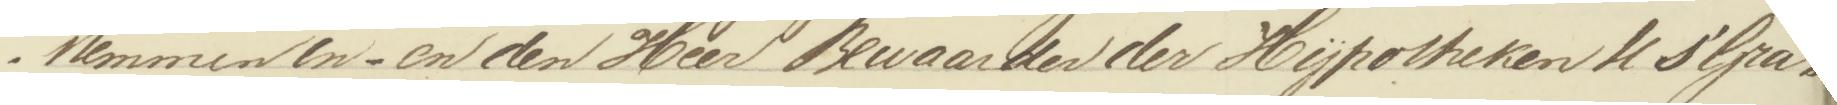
„stemmen in - en den Heer Bewaarder der Hijpotheken te S´Gra„
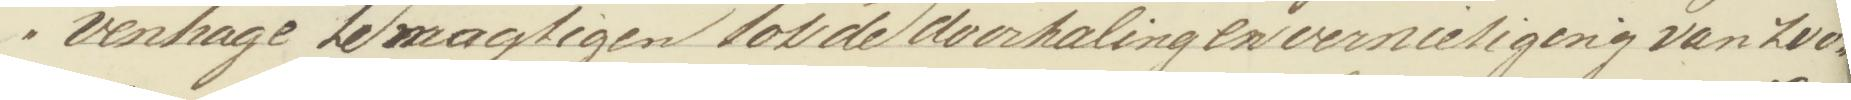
„venhage te magtigen tot de doorhaling en vernietiging van zoo„
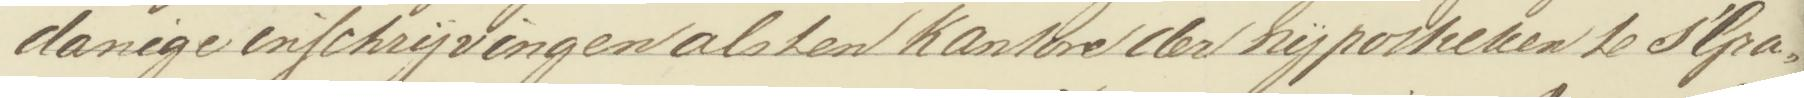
danige inschrijvingen als ten kantore der hijpotheken te s´Gra„
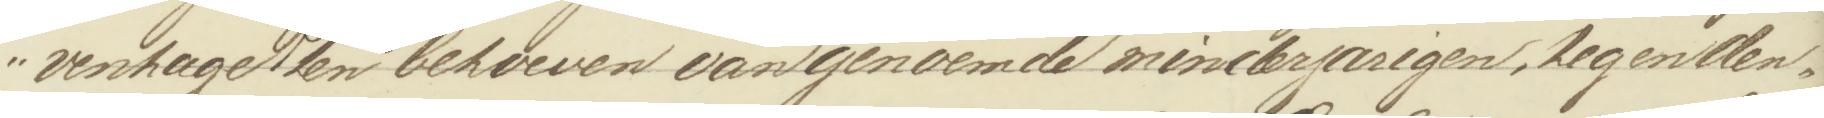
„venhage ¶ ten behoeven van genoemde minderjarigen, tegen den„
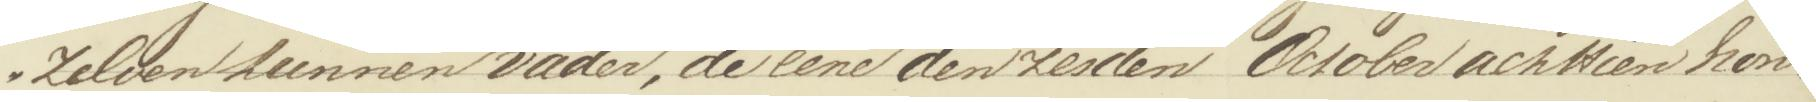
„zelven hunnen vader, de eene den zesden October achttien hon
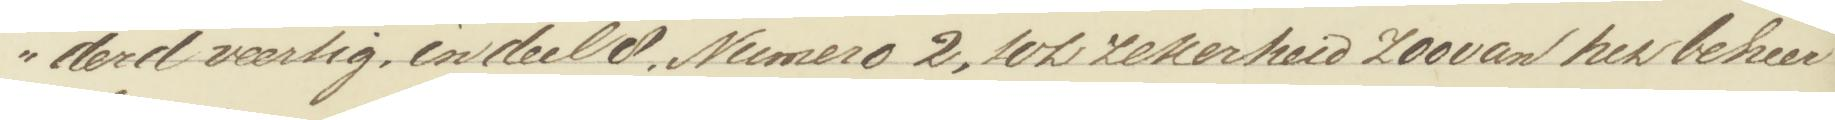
„derd veertig, in deel 8, Numero 2, tot zekerheid zoovan het beheer
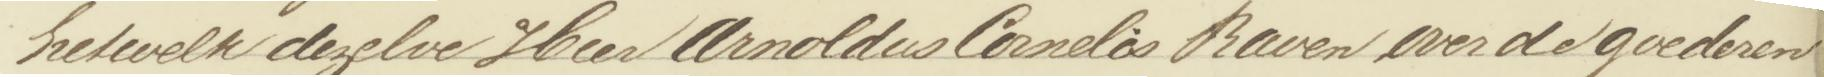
hetwelk dezelve Heer Arnoldus Cornelis Raven over de goederen
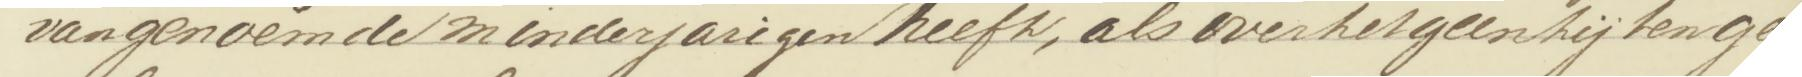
van genoemde minderjarigen heeft, als over hetgeen hij ten ge
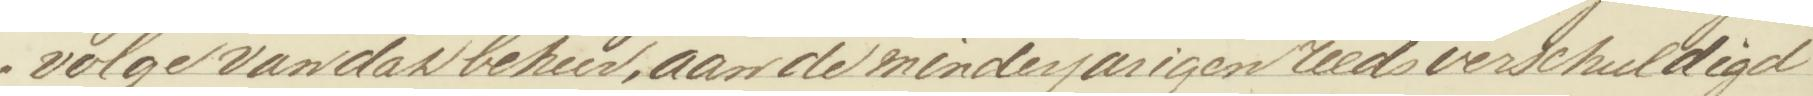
„volge van dat beheer, aan de minderjarigen reeds verschuldigd
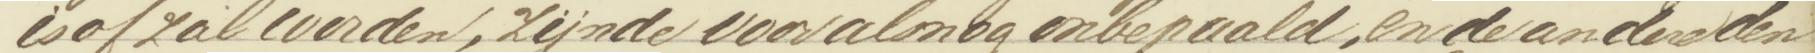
is of zal worden, zijnde vooralsnog onbepaald, en de andere den
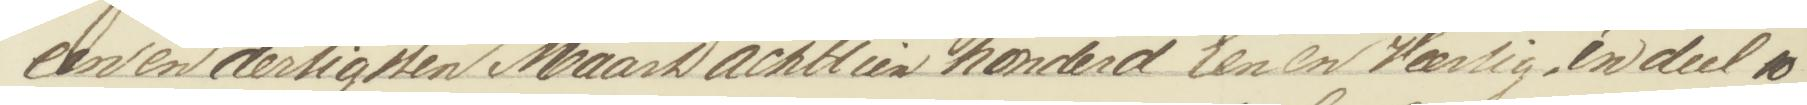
een en dertigsten Maart achttien honderd Een en Veertig, in deel 10
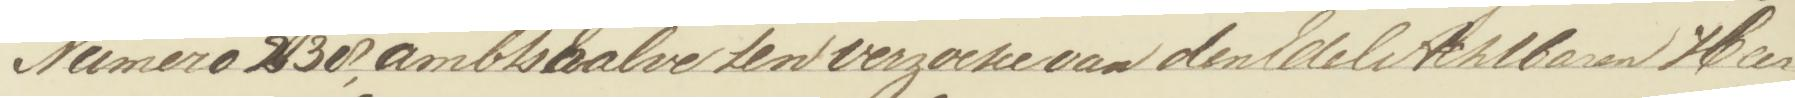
Numero 238, ambtshalve ten verzoeke van den EdelAchtbaren Heer
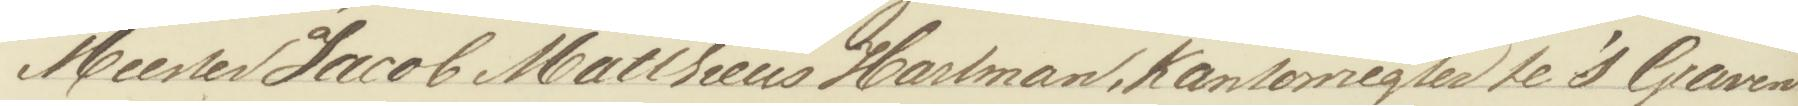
Meester Jacob Mattheus Hartman, Kantonregter te 's Graven
